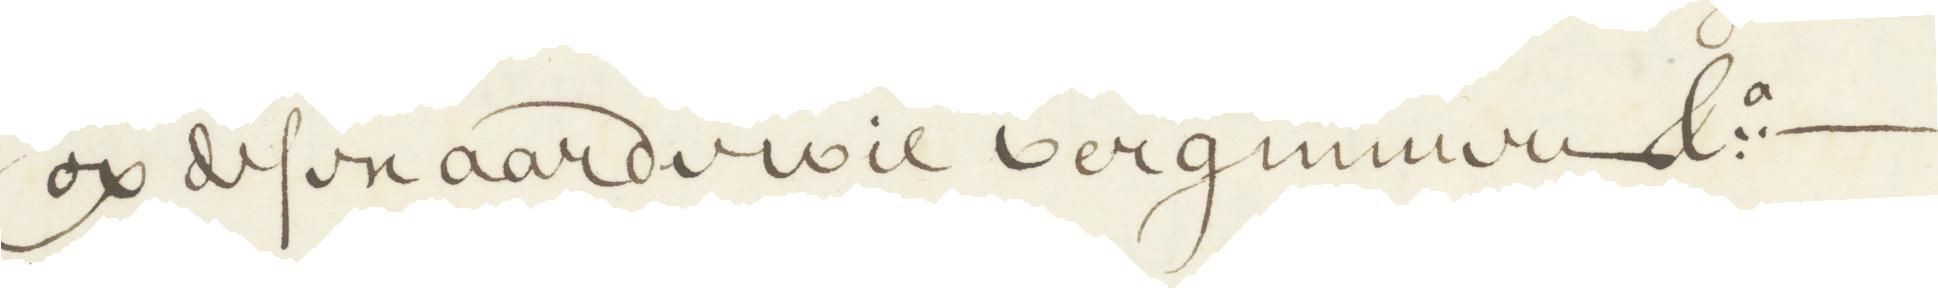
op deser aarde wil vergunnen &:a
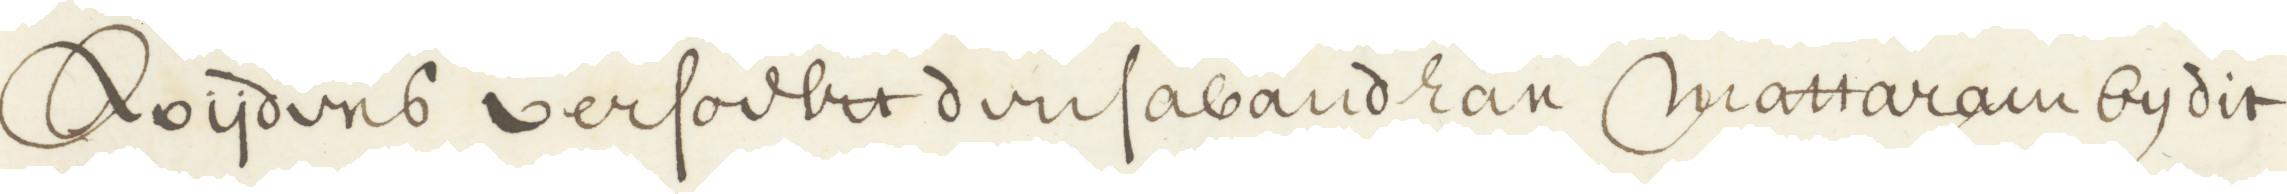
wijders versoekt den sabandhar mattaram by dit
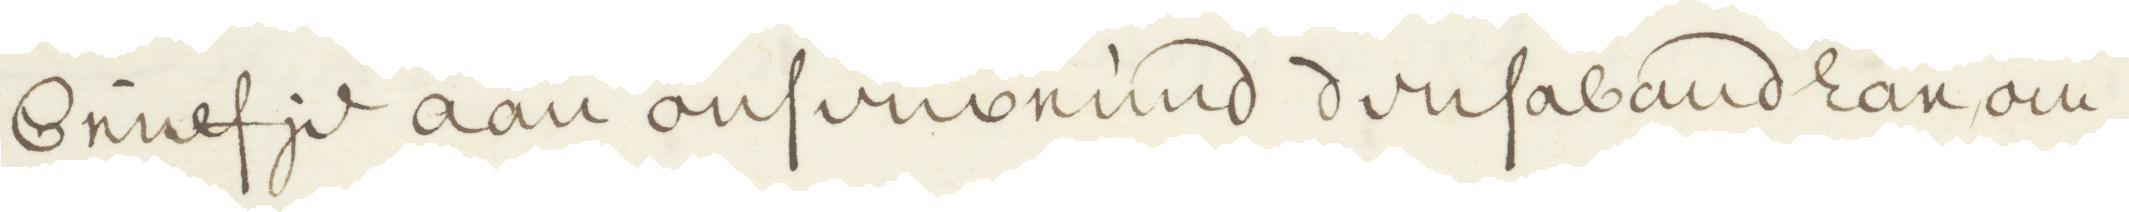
briefje aan onsen vrund den sabandhar, om
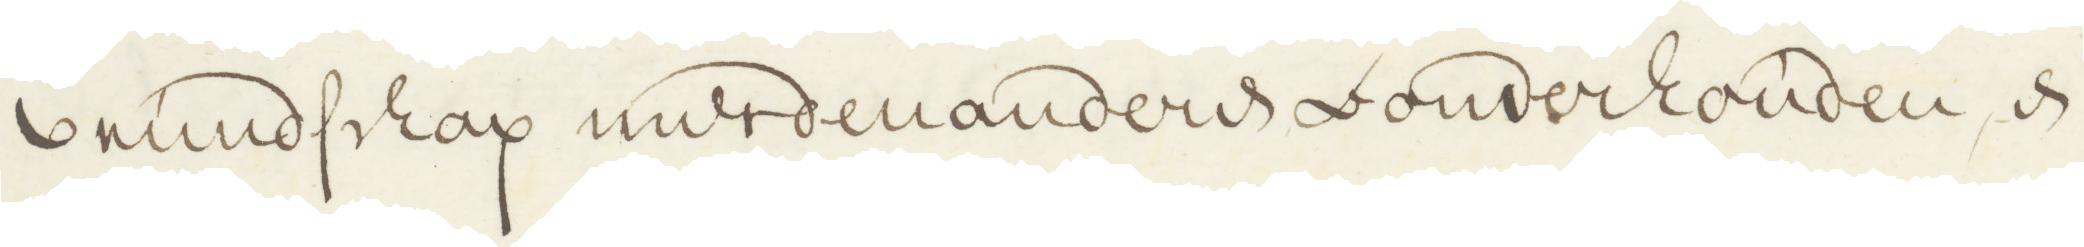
vrundschap met den anderen te onderhouden, en
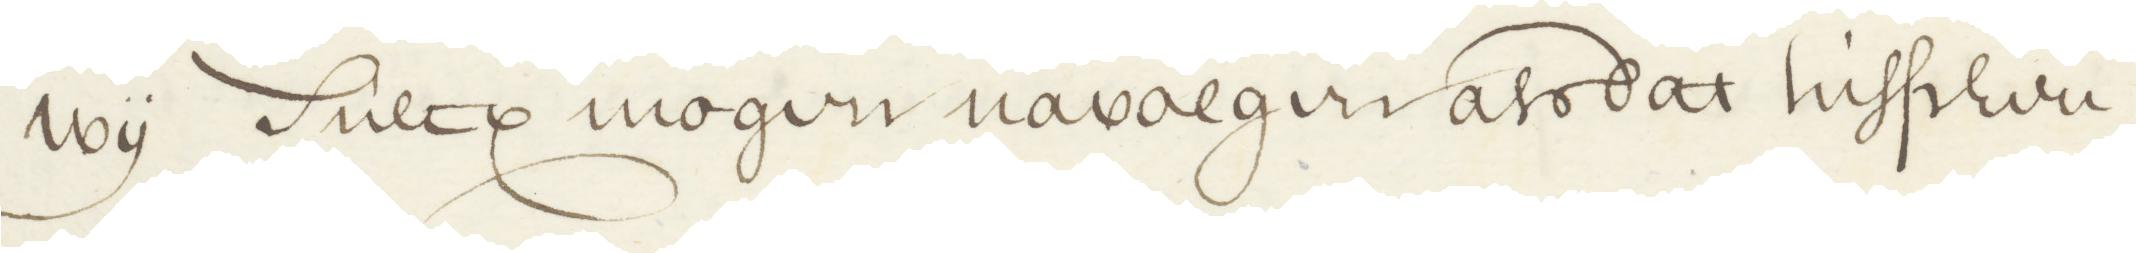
wij sulcx mogen navolgen als dat tusschen
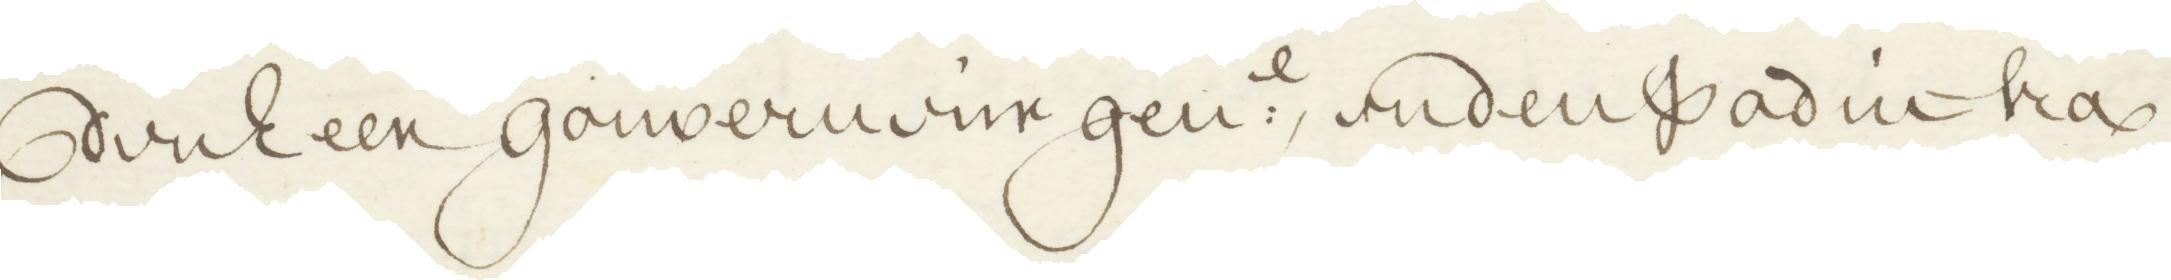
den heer gouverneur gen:l, en den paducka
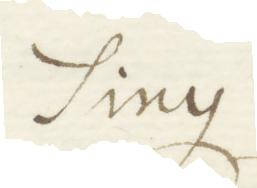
Siny
